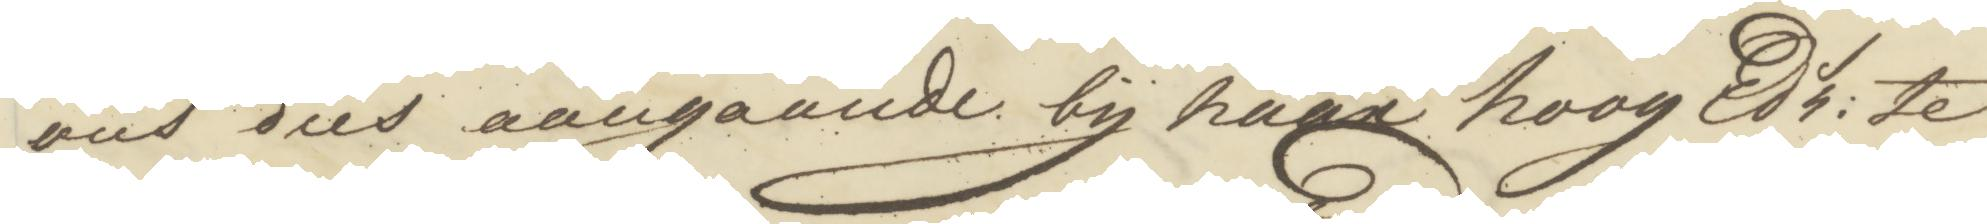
ons dies aangaande bij haar hoog Ed„s te
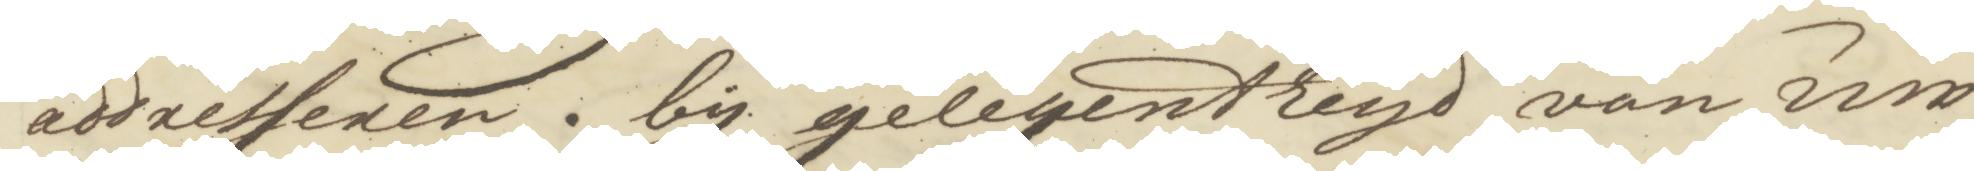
addresseren . bij gelegentheijd van uw
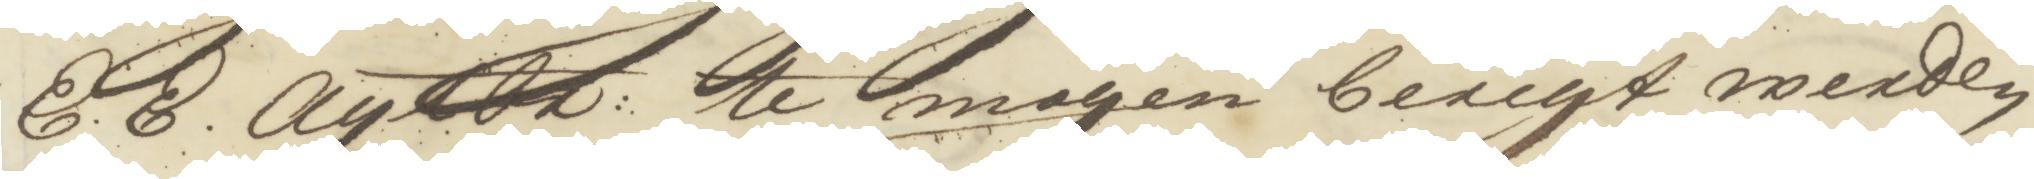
E. E. Agtbr: te mogen berigt werden
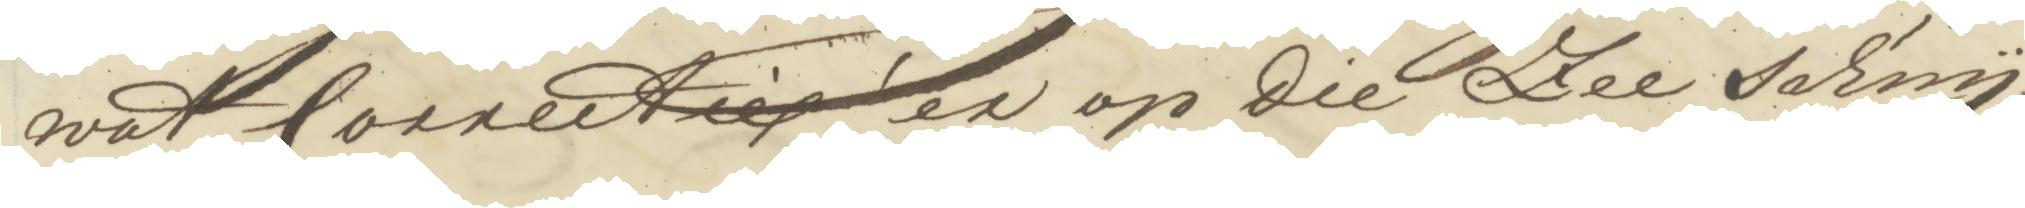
wat Correctie 'er op die zee schuij
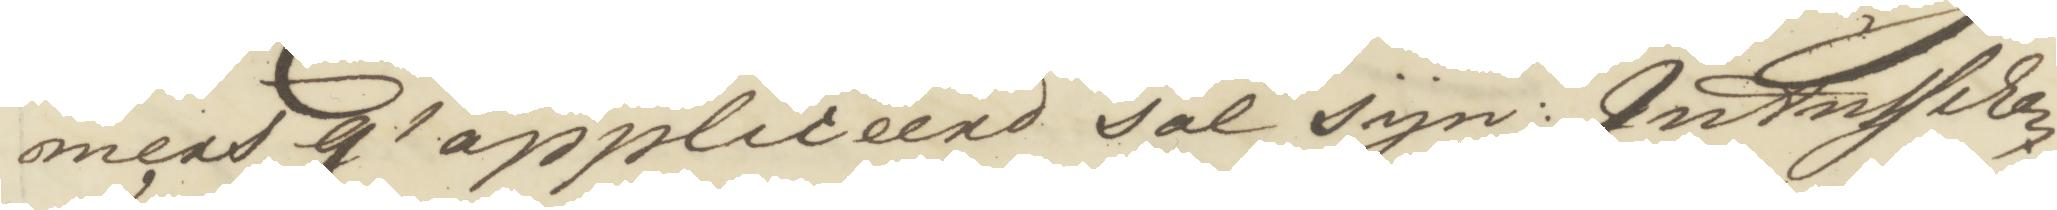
mers g’appliceerd sal sijn: Jntussche
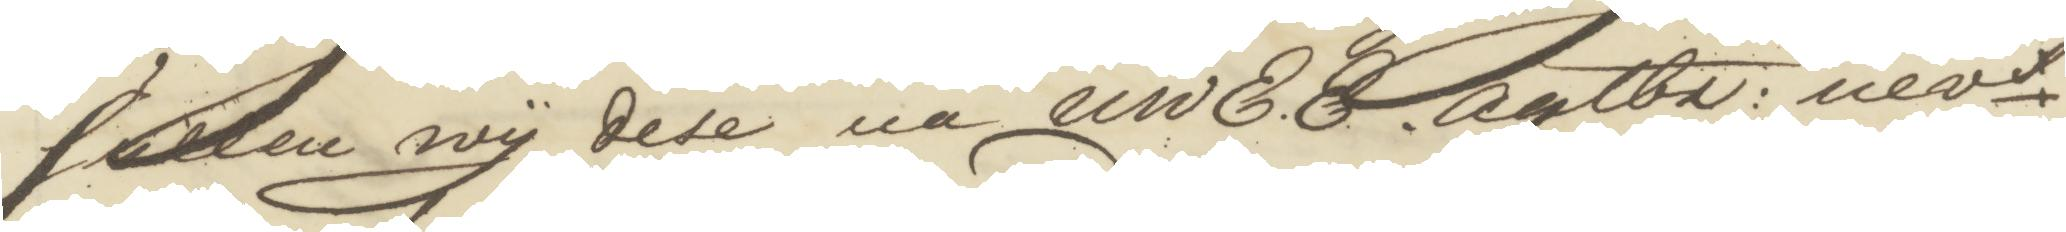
sullen wij dese na uw E.E. agtbr: nev–s
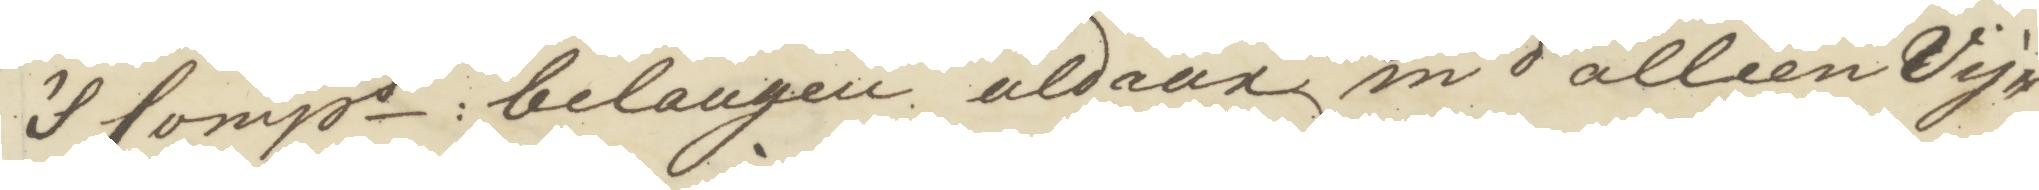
’s Comp–s: belangen aldaar in d' alleen Vij
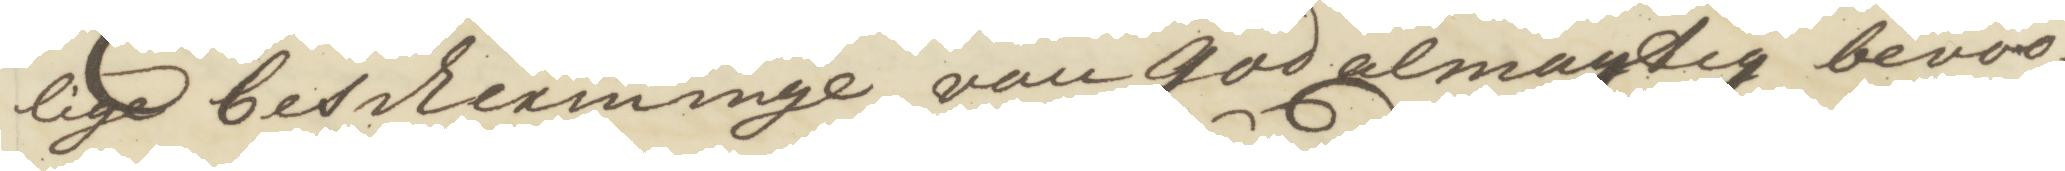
lige bescherminge van god almagtig bevoo„
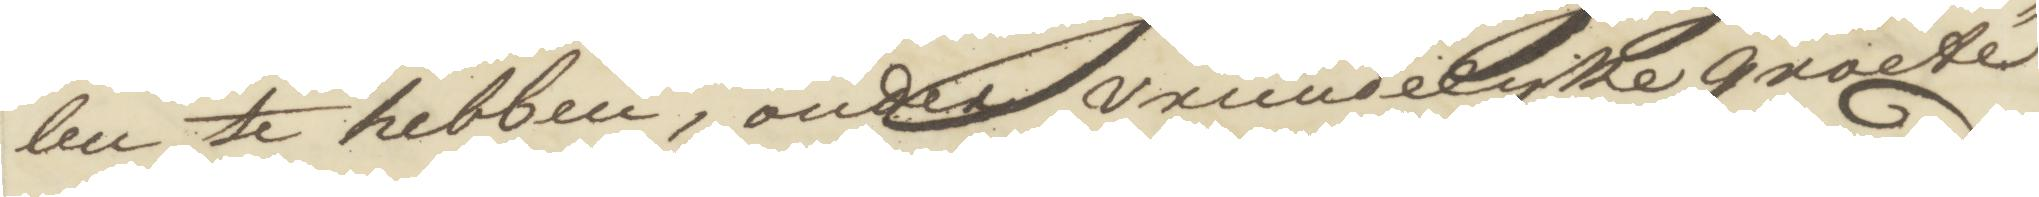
len te hebben, onder vrundelijke groete
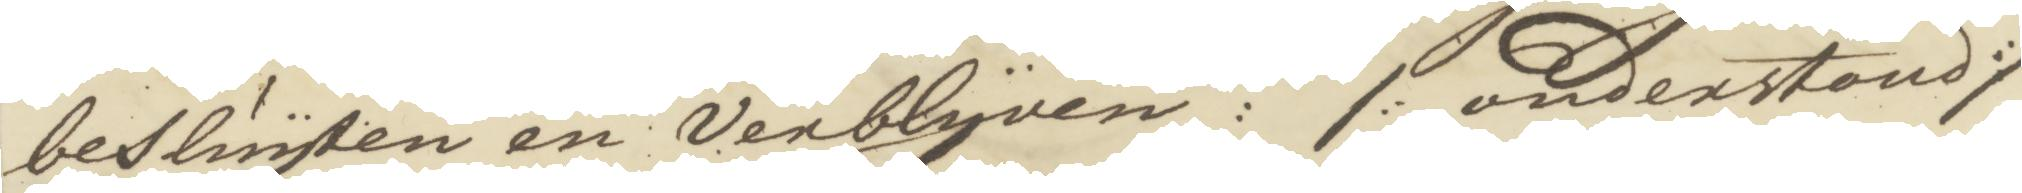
besluijten en verblijven : /: onderstond:/
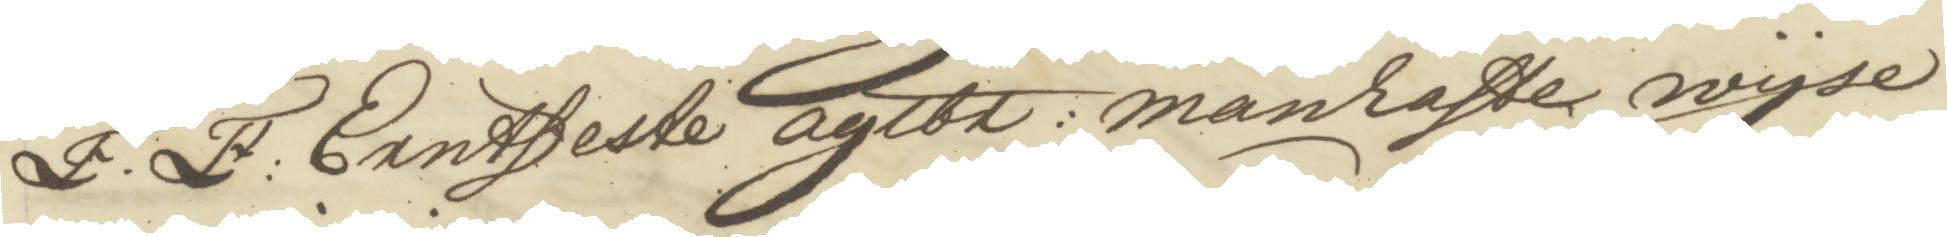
E. E: Erntfeste agtbr: manhafte wijse
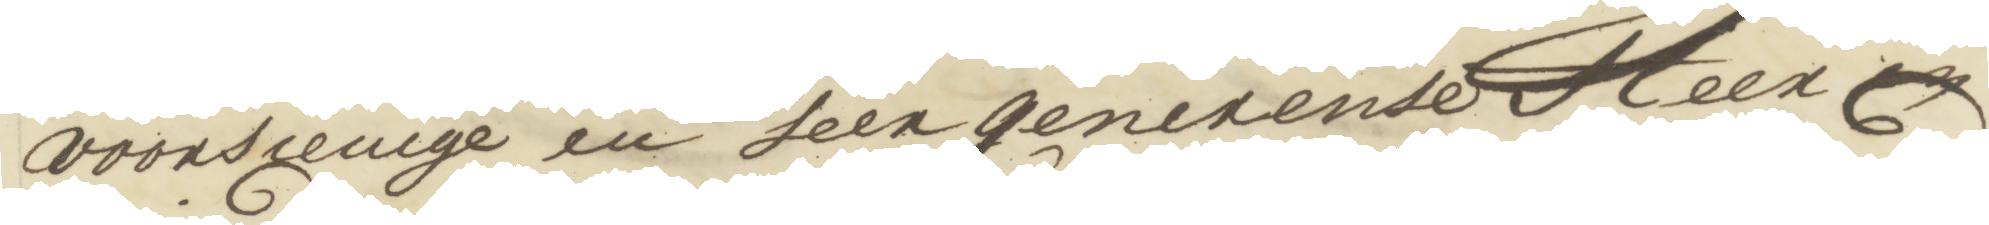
voorsienige en seer genereuse Heer en
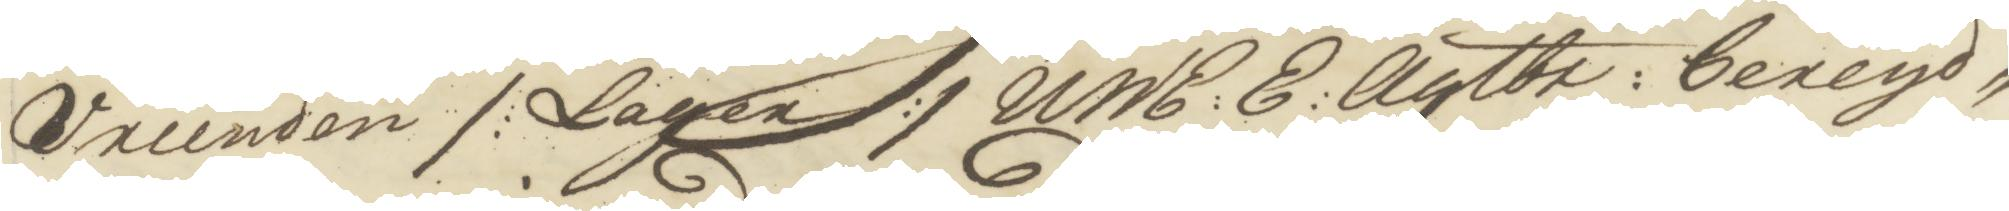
Vrienden /: Lager :/ UWE: E: Agtbr: bereijd
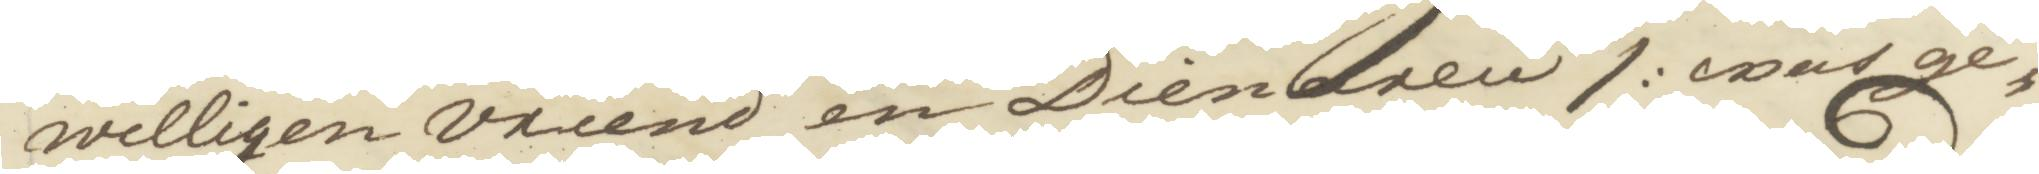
willigen vriend en Dienaren /: was ge„
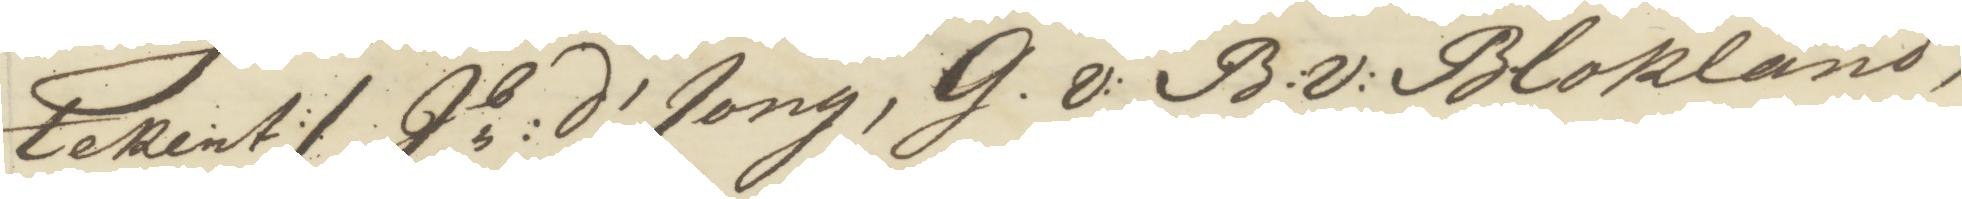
tekent :/ J„b. d’ Jong, G. v: B: v: Blokland
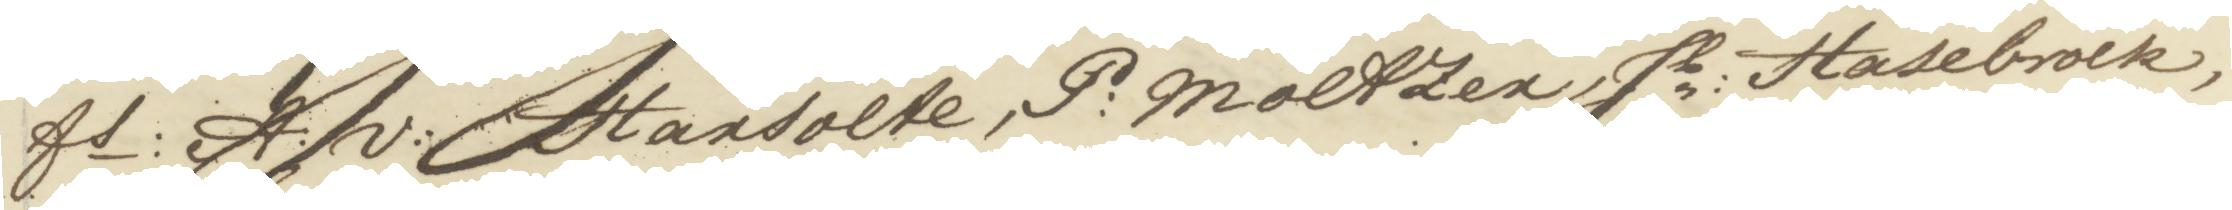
f–s: A: v: Harsolte, P: moltzer, J„b: Hasebroek,
